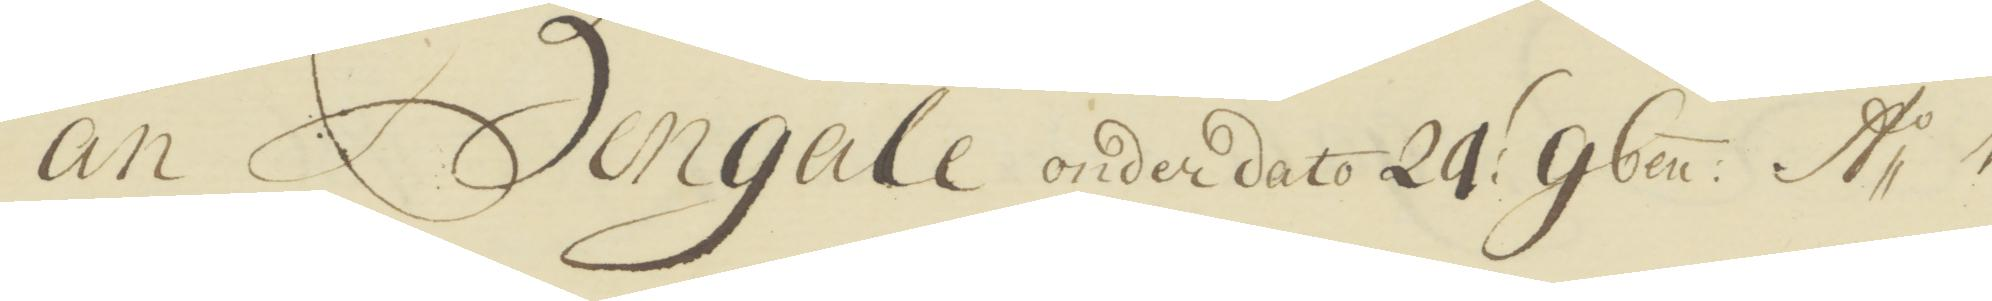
Van Bengale onder dato 24:' 9ber: A„o 1736.
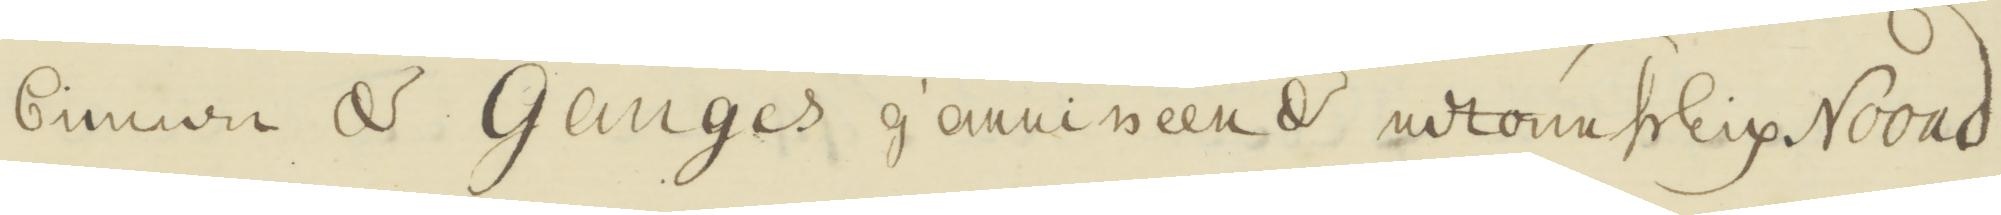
binnen de Ganges g’arriveerde retourschip Noord
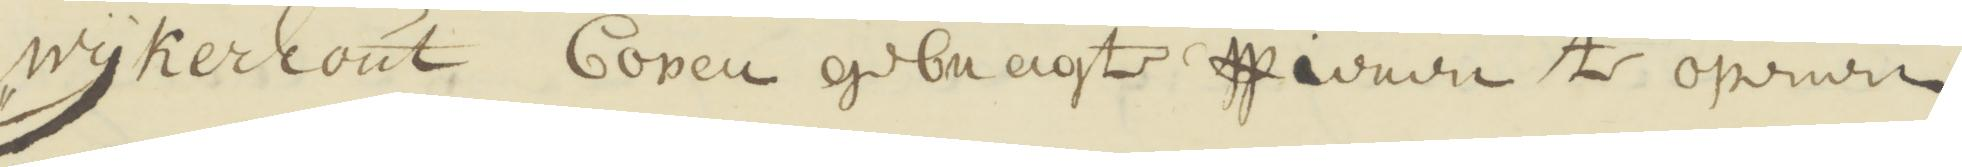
„wijkerhout boven gebragte ppieren te openen
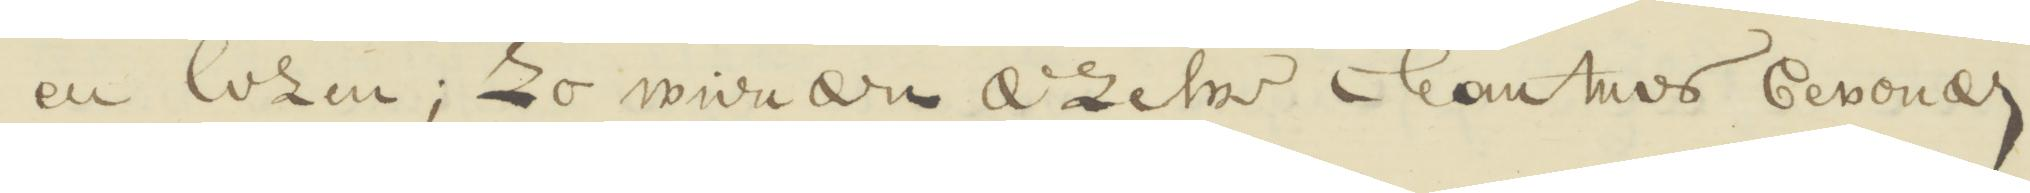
en lezen; zo wierden dezelve chartres bevonden
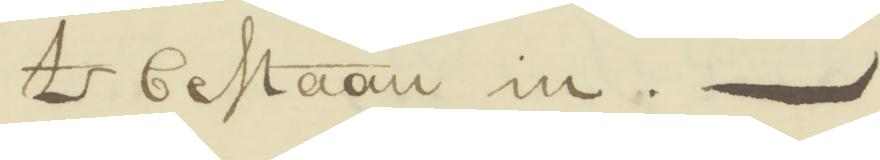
te bestaan in.
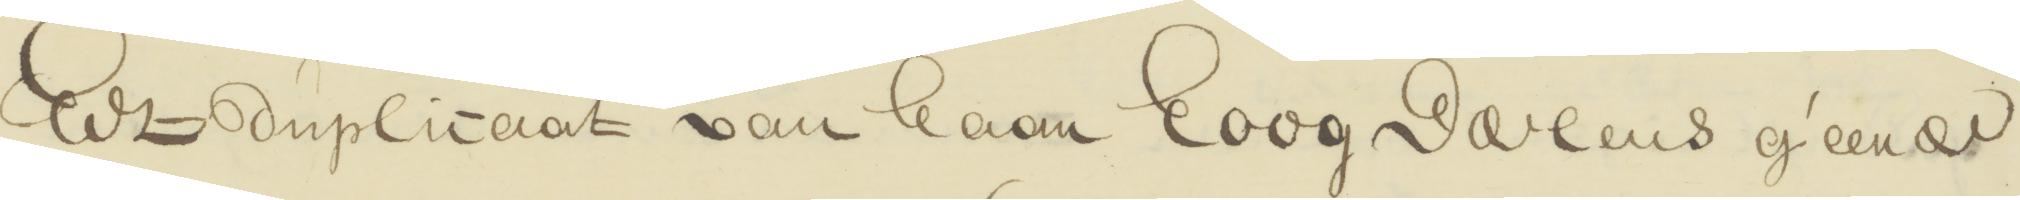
het duplicaat van haar hoog Edelens g’eerde
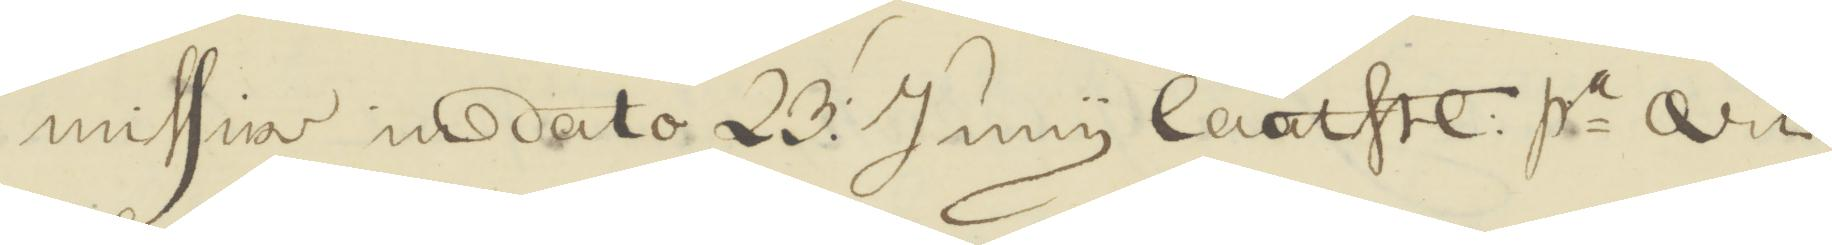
missive in dato 23:' Junij laatstl: p=r den
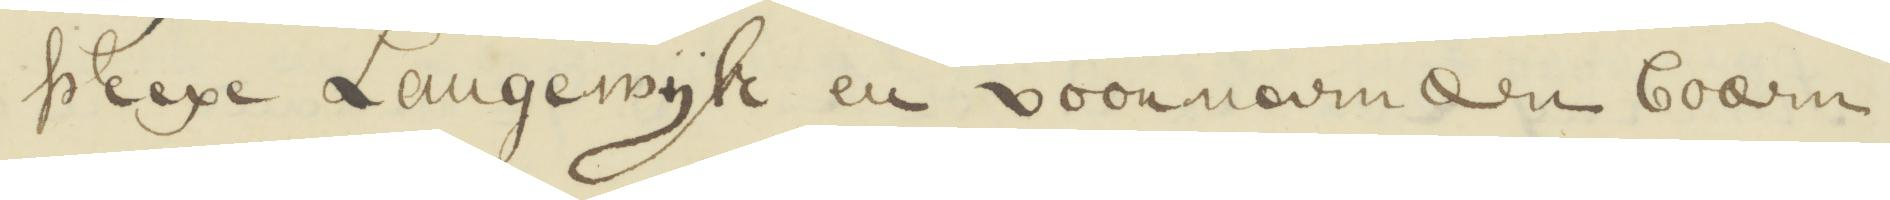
schepe Langewijk en voornoemden bodem
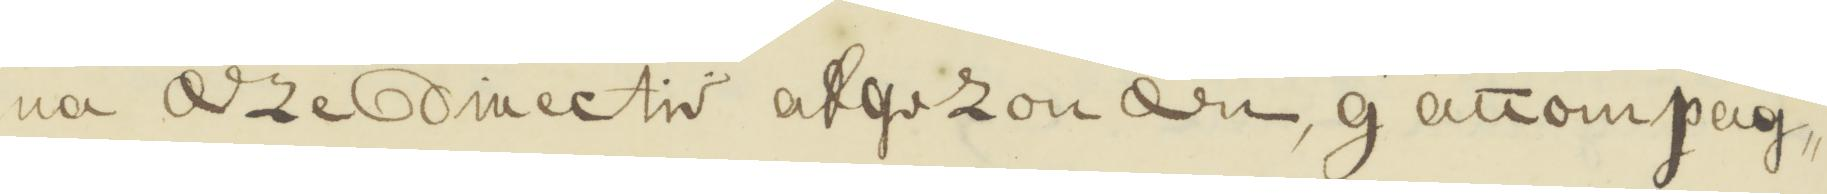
na deze directie afgezonden, gaccompag„
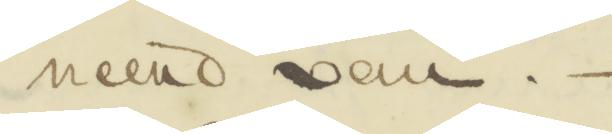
neerd van.
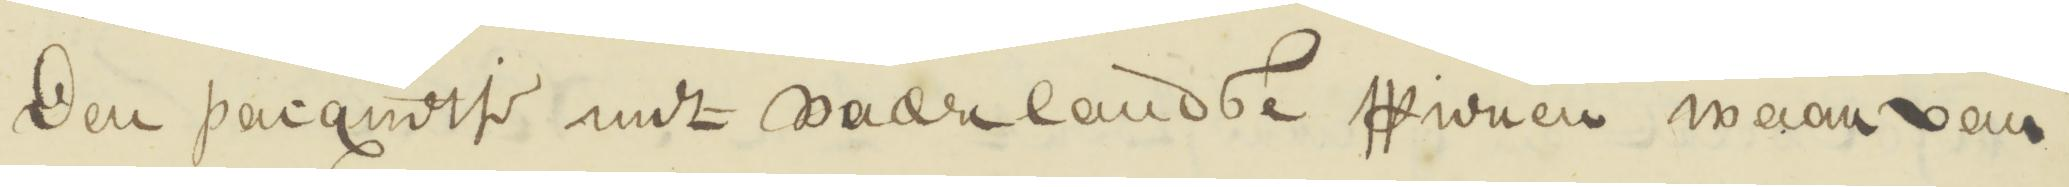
Een pacquetje met vaderlandse ppieren waar van
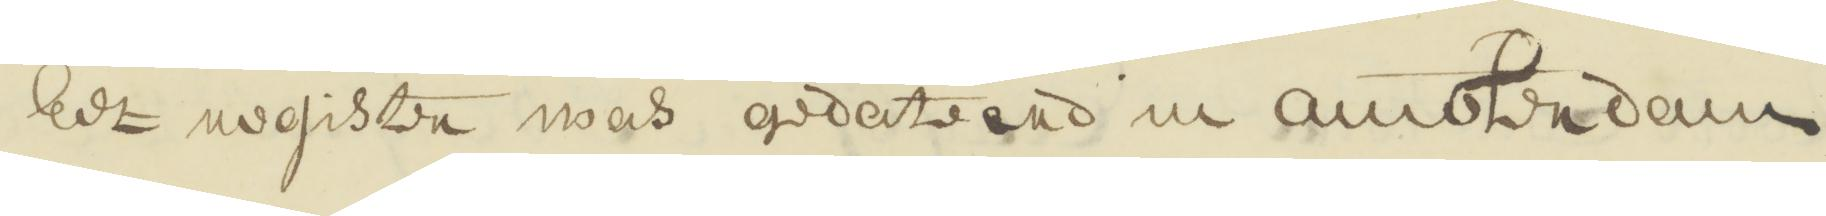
het register was gedateerd in amsterdam
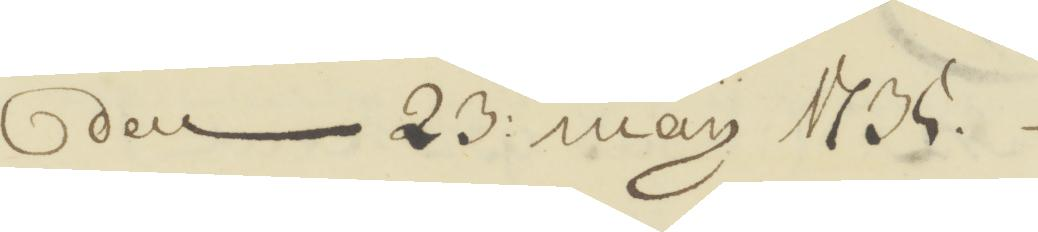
den 23:' maij 1735.
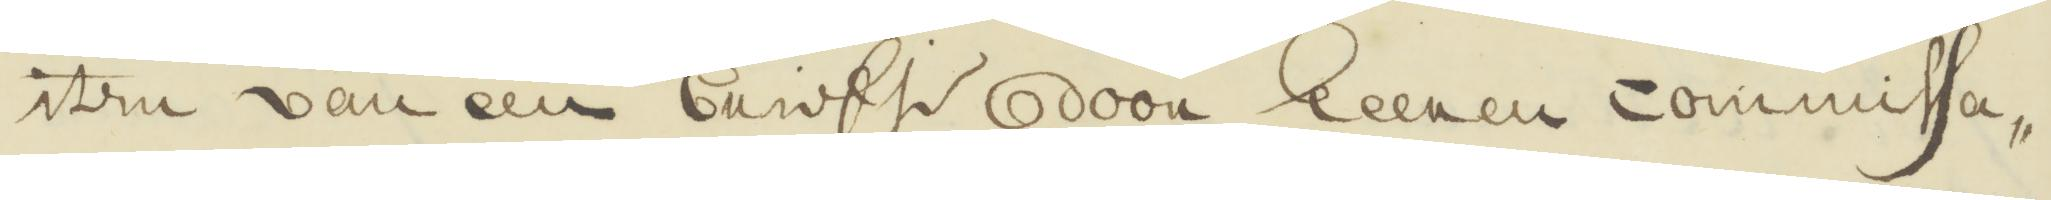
item van een briefje door heeren commissa„
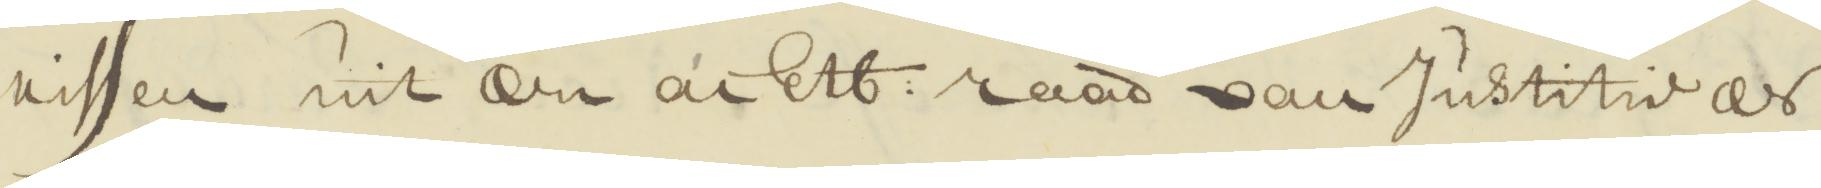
rissen uit den achtb: raad van Justitie des
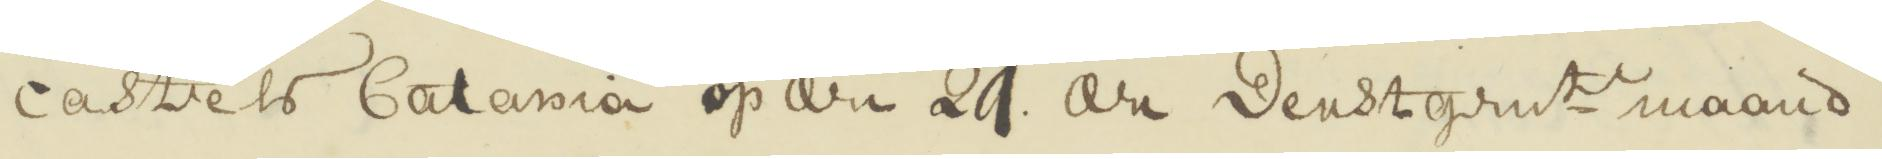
castels batavia op den 24. der Eerstgem=te maand
